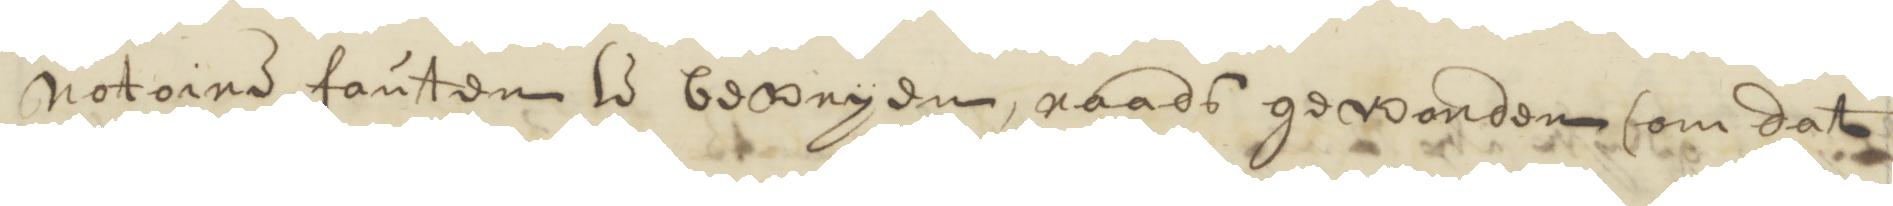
notoire fouten te bevrijen, raads geworden (om dat
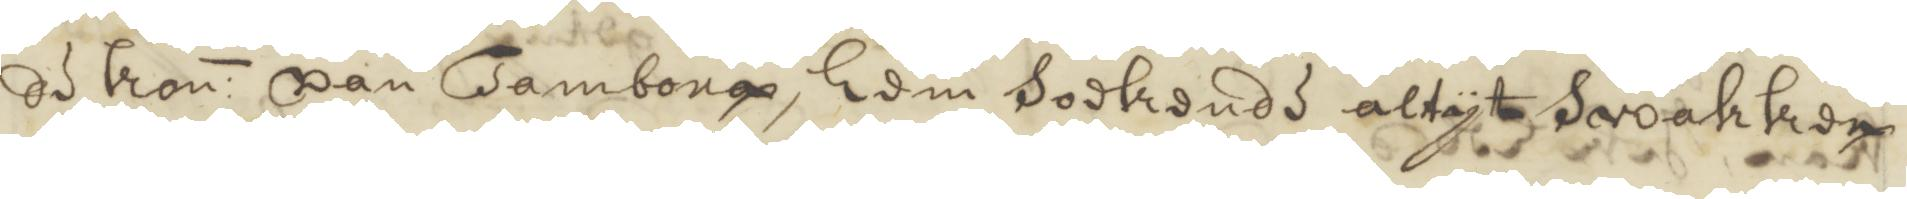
de kon: van Tambora, hem Soekende altijt Swakker
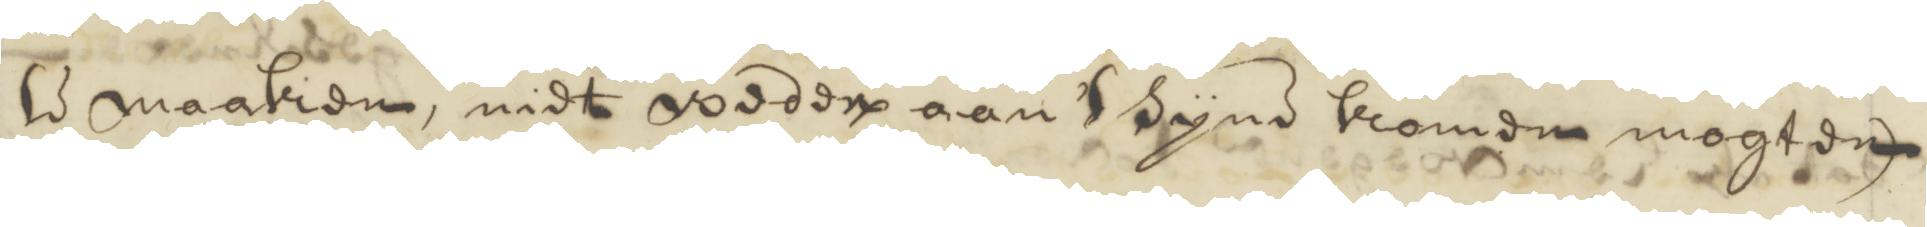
te maaken, niet weder aan ’t Sijne komen mogten
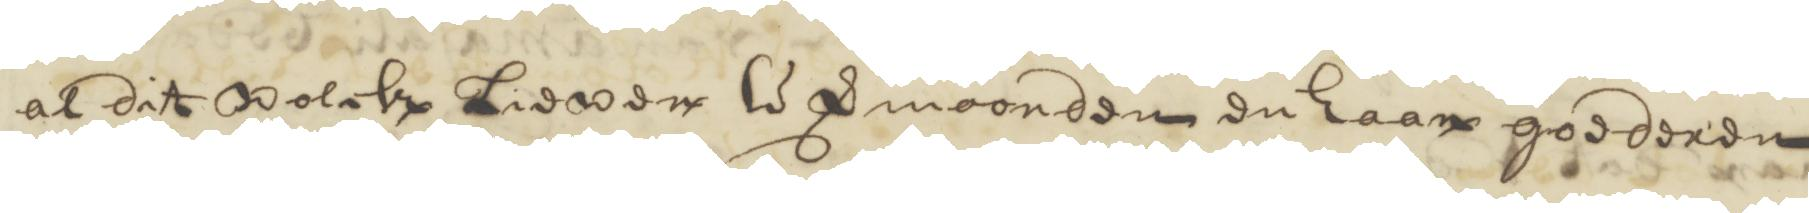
al dit volck Liever te vermoorden en haar goederen
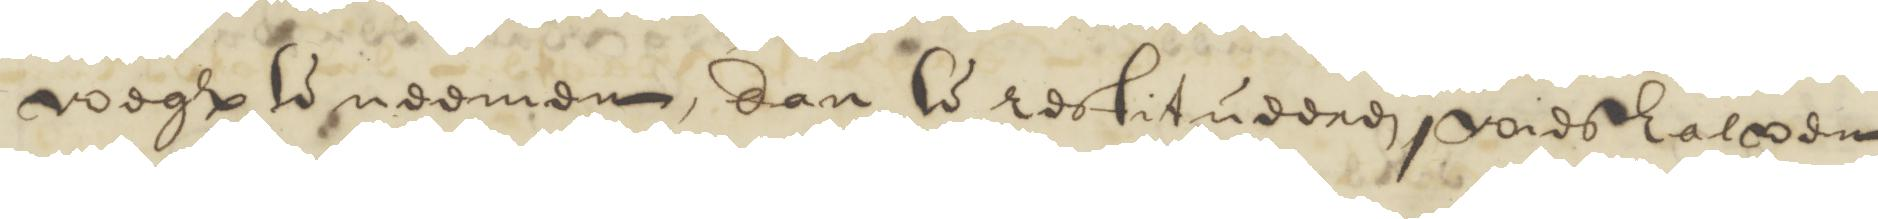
wegh te neemen, dan te restitueeren; wies halven
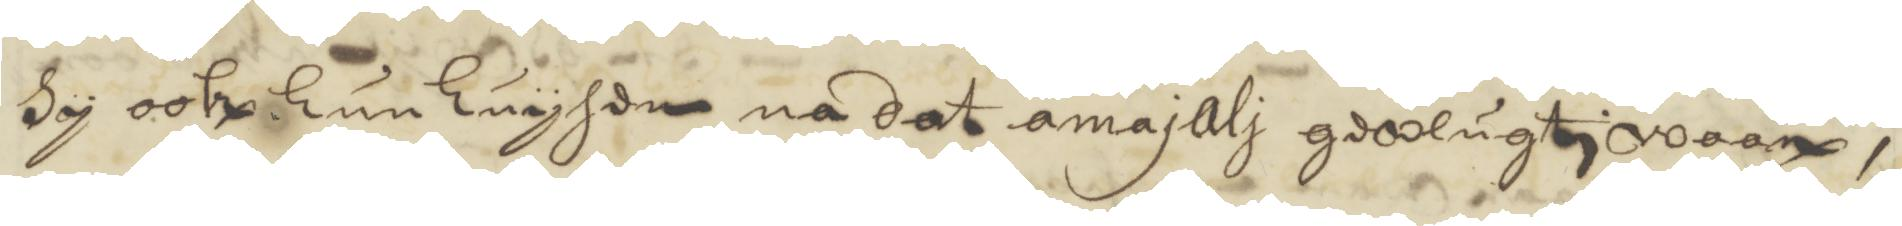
Sij ook hun huijsen na dat amaj Alj gevlugt waar,
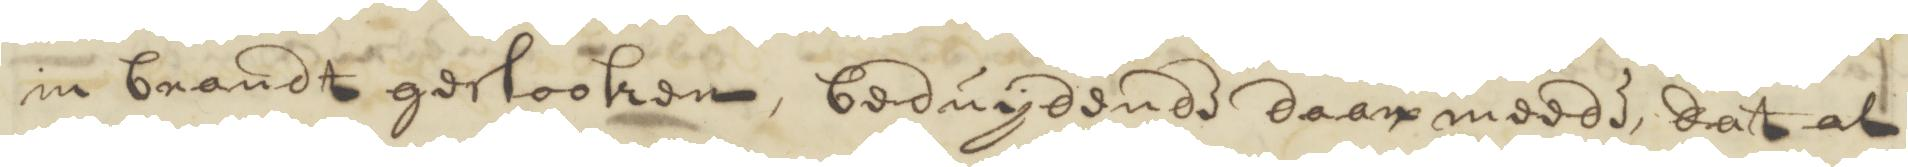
in brandt gestooken, beduijdende daar meede, dat al
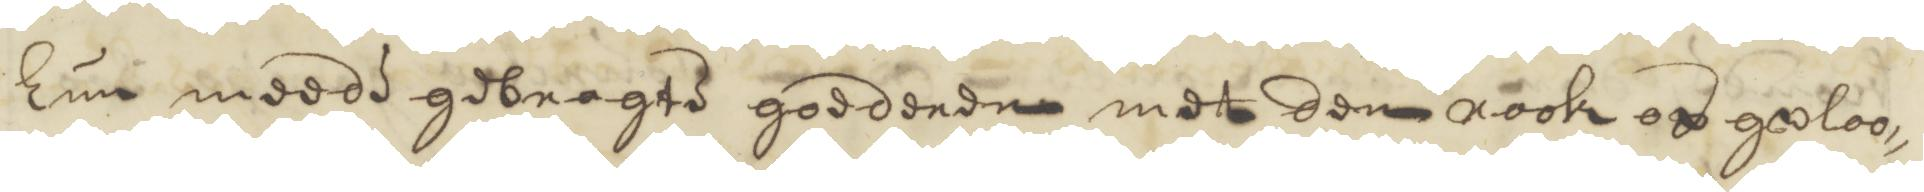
hun meede gebragte goederen met den rook over gvloo„
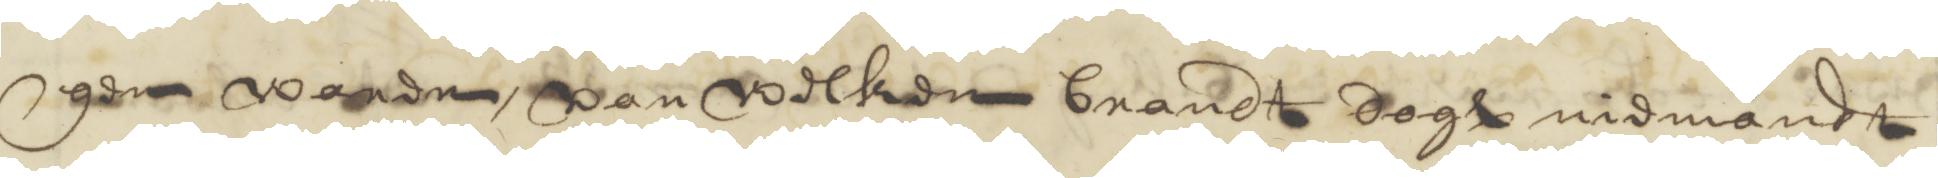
gen waren, van welken brandt dogh niemandt
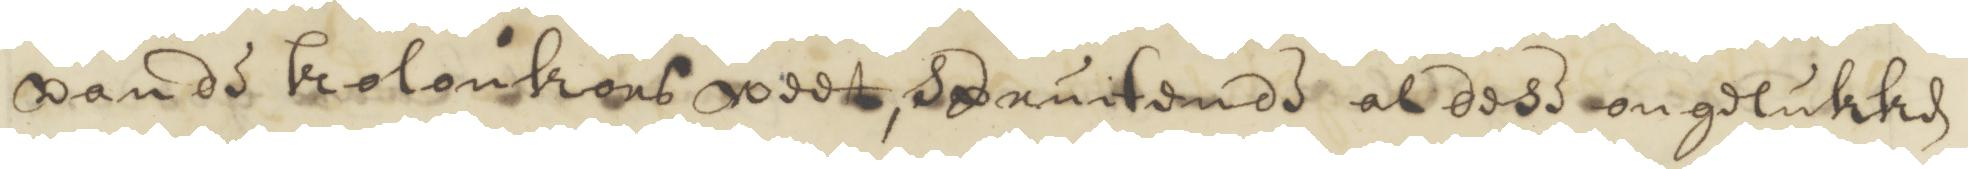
van de koloukors weet, spruitende al dese ongelukken
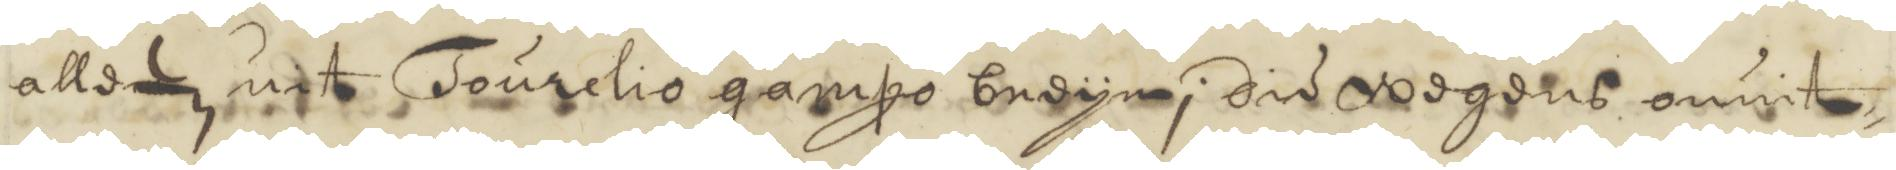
alleen uit Tourelio gampo breijn, die wegens onuit„
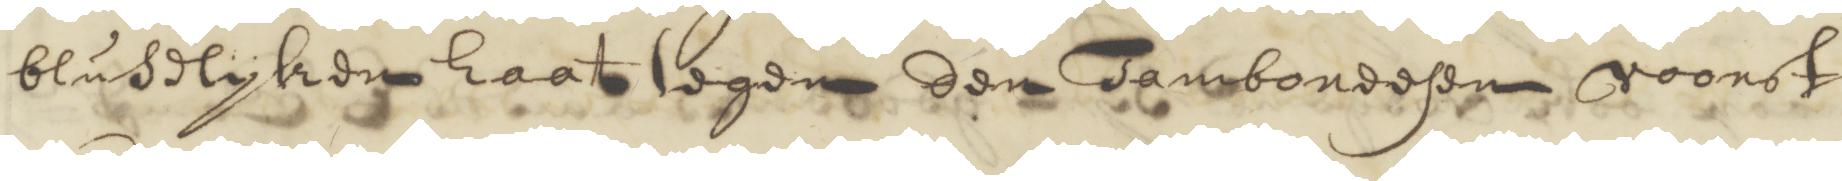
bluselijken haat tegen den Tamboreesen voorst
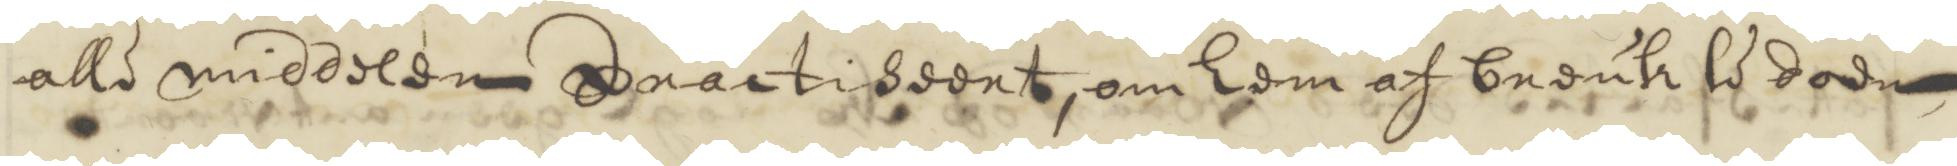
alle middelen practiseert, om hem af breuk te doen,
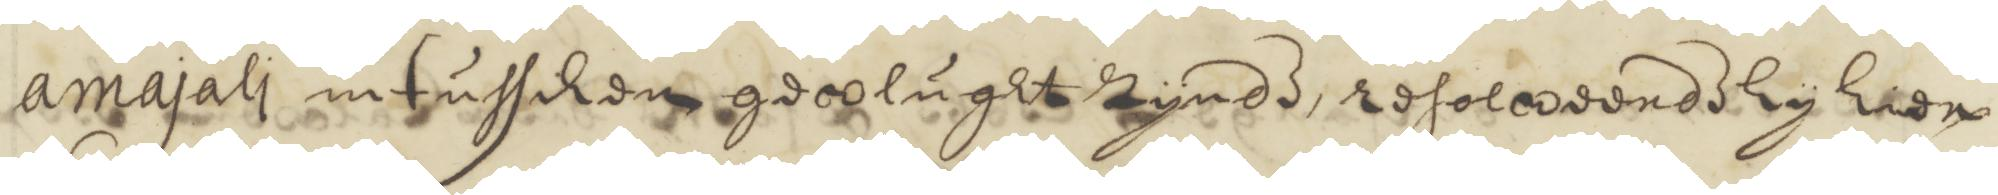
amajalj in tusschen gevlught Zijnde, resolveerde hij haer
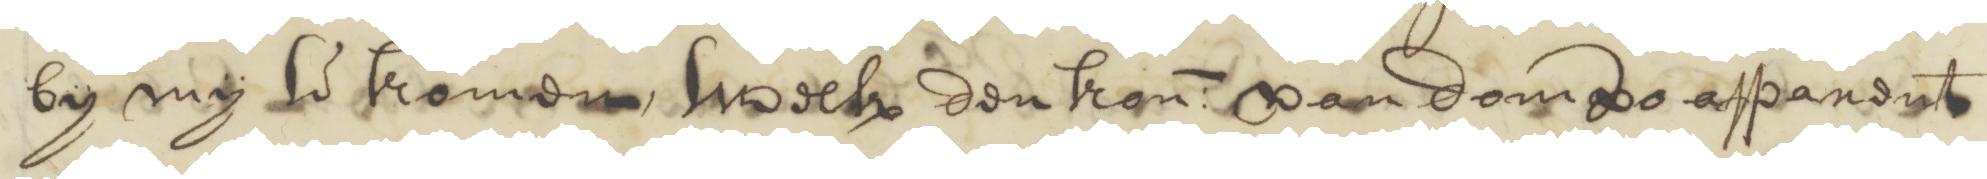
bij mij te komen, twelk den kon: van dompo apparent
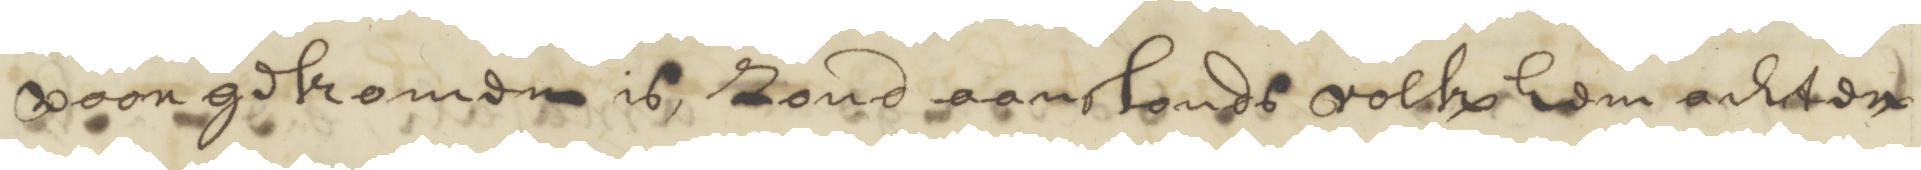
voorgekomen is, Zond aanstonds volk hem achter
